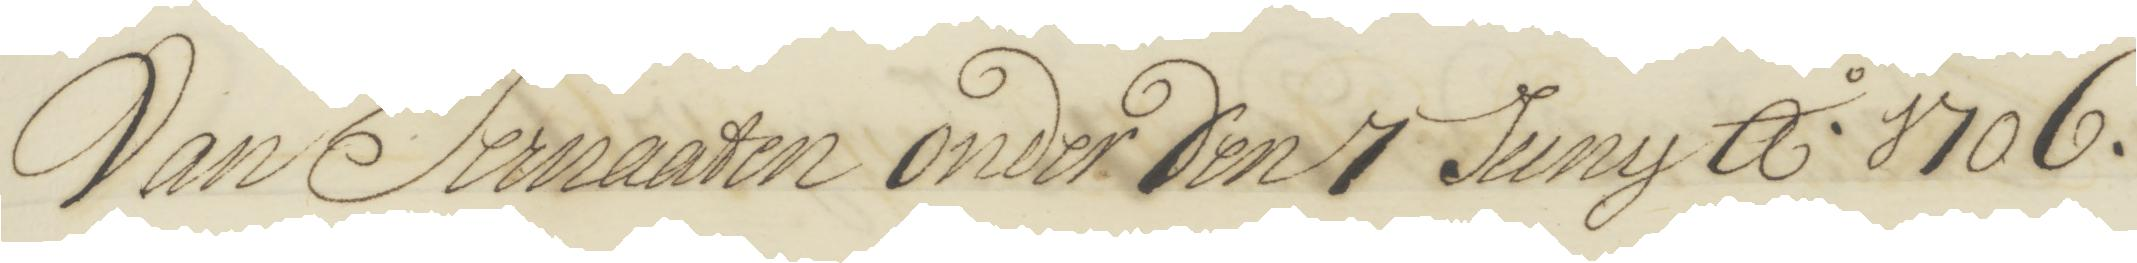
Van Ternaaten onder den 7 Iuny A.o 1706.
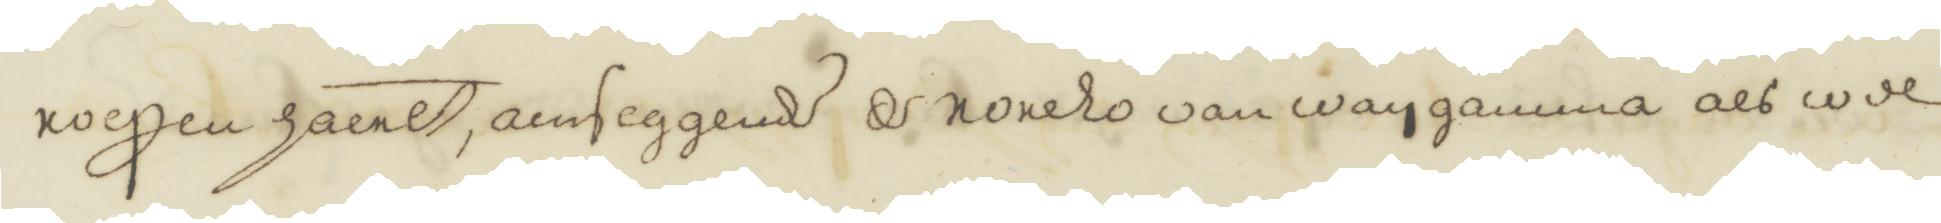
roepen haerlijk, aenseggende de roreho van waygamma als wel
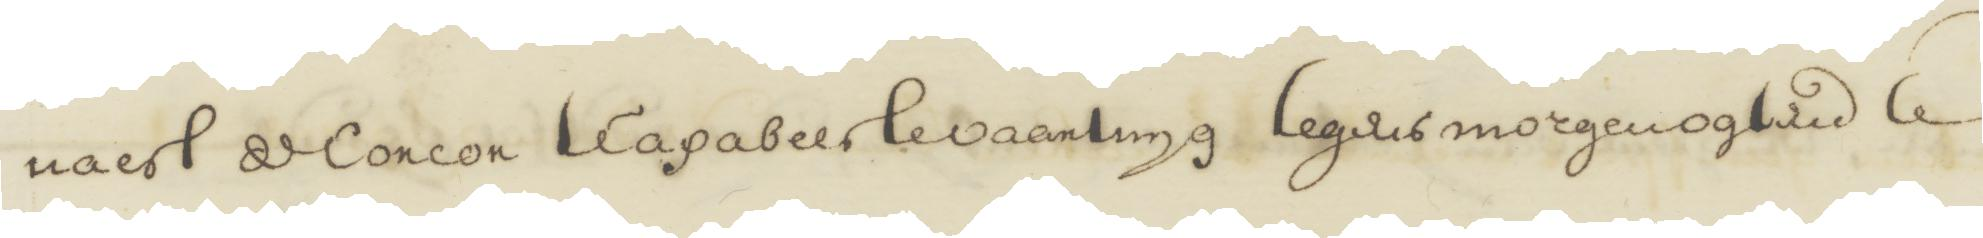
naest de Corcor tCapabelste vaartuyg tegens morgen ogtend te
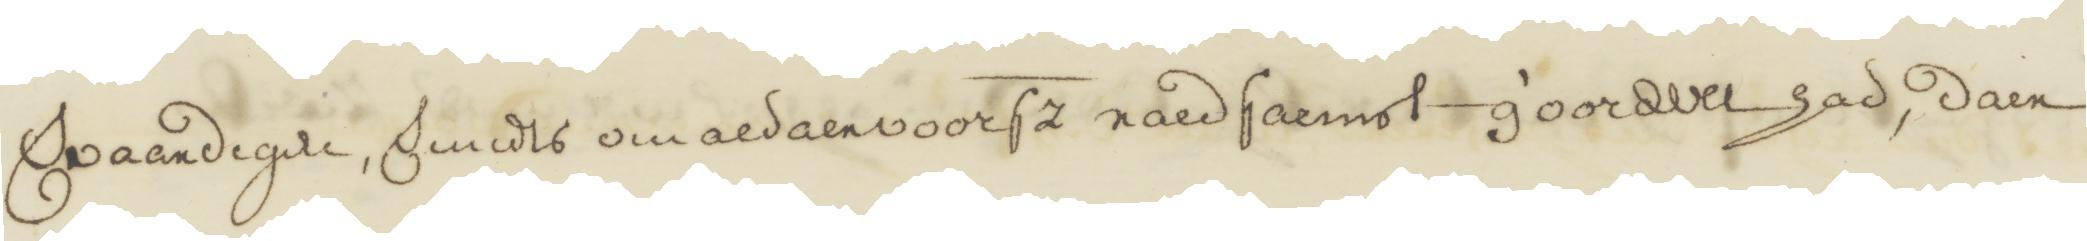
vervaardigen, vermidts om aldaer voorsz raedsaemst g’oordeelt had, daer
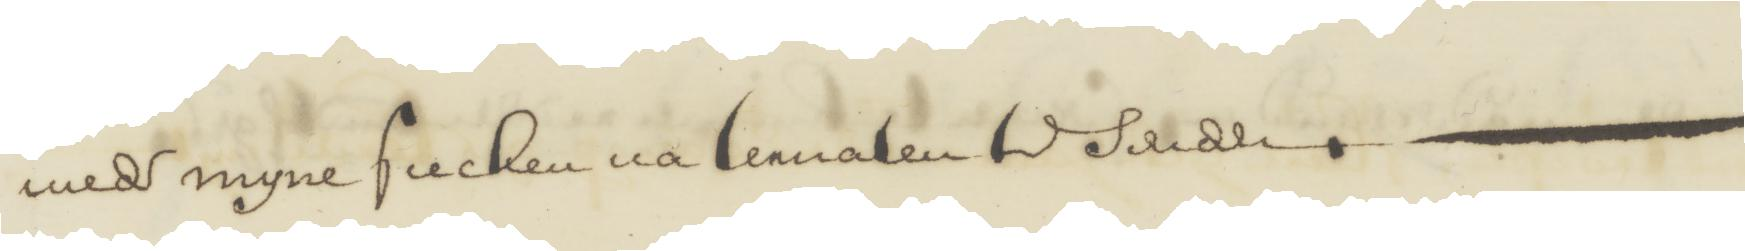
mede myne siecken na ternaten te senden.
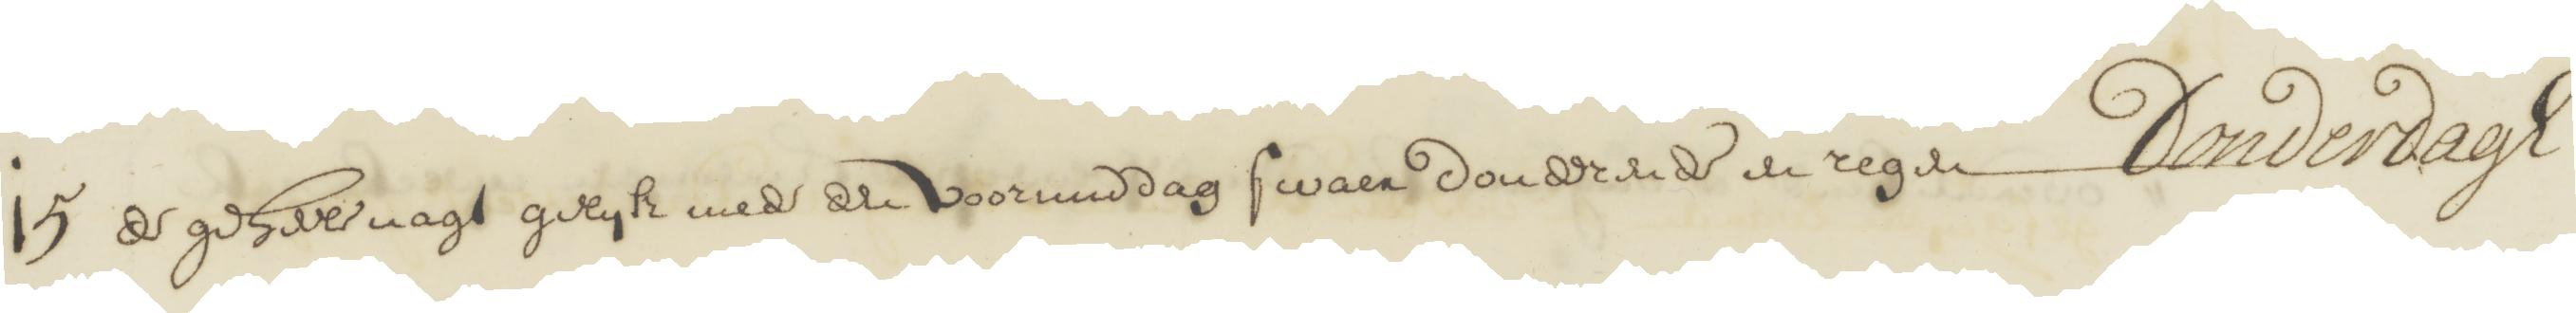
15 de geheele nagt gelyk mede den voormiddag swaer donderende en regen Donderdagh
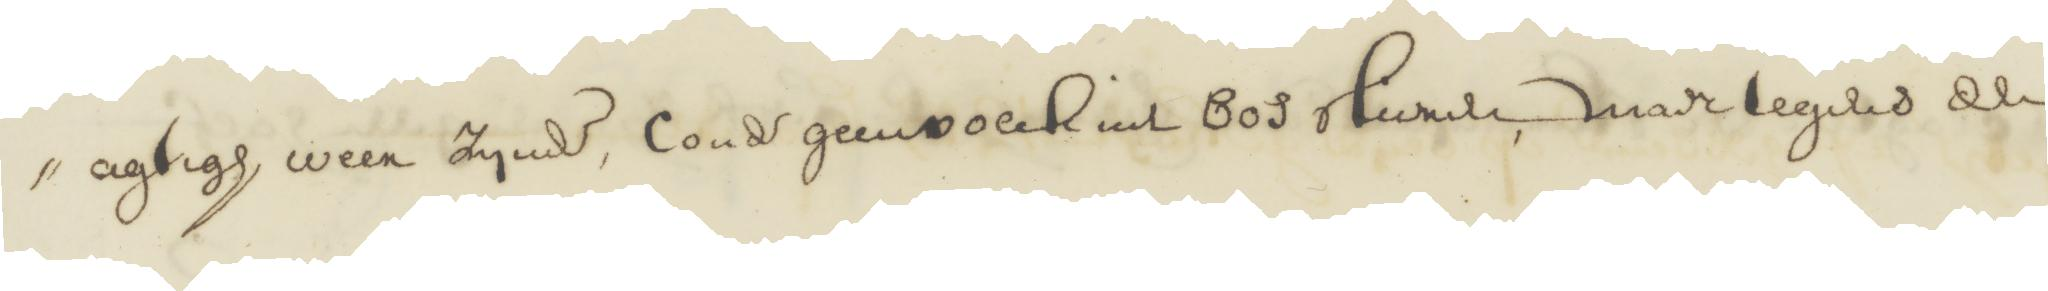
„agtigh weer zynde, Conde geenvolck int Bos stieren, maer tegens den
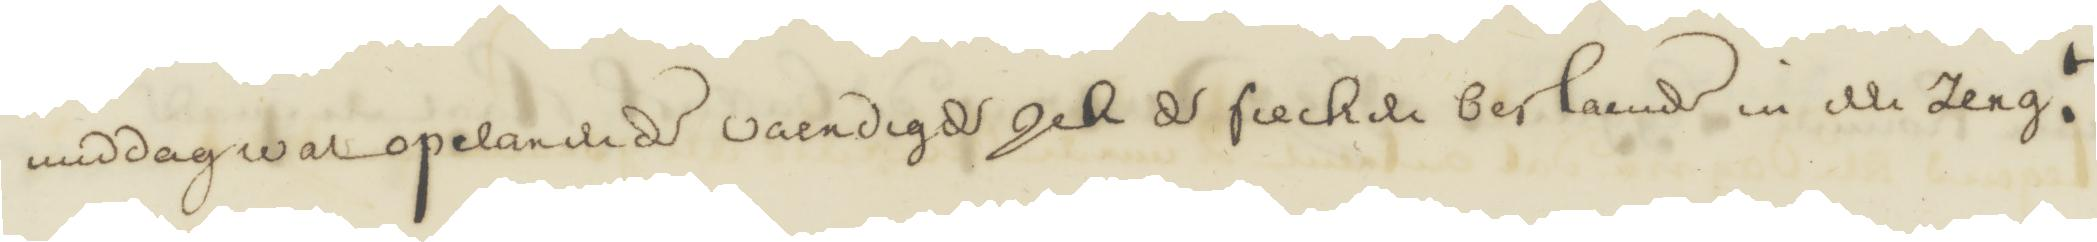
middag wat opclarende vaerdigde jck de siecken bestaende in een zerg.t
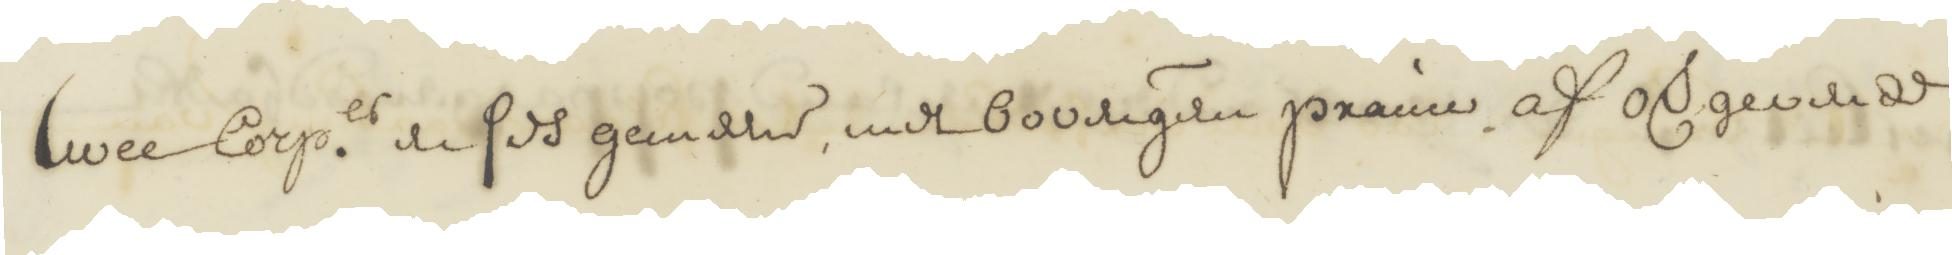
twee Corp.ls en ses gemeene, met bovengen prauw af overgevende
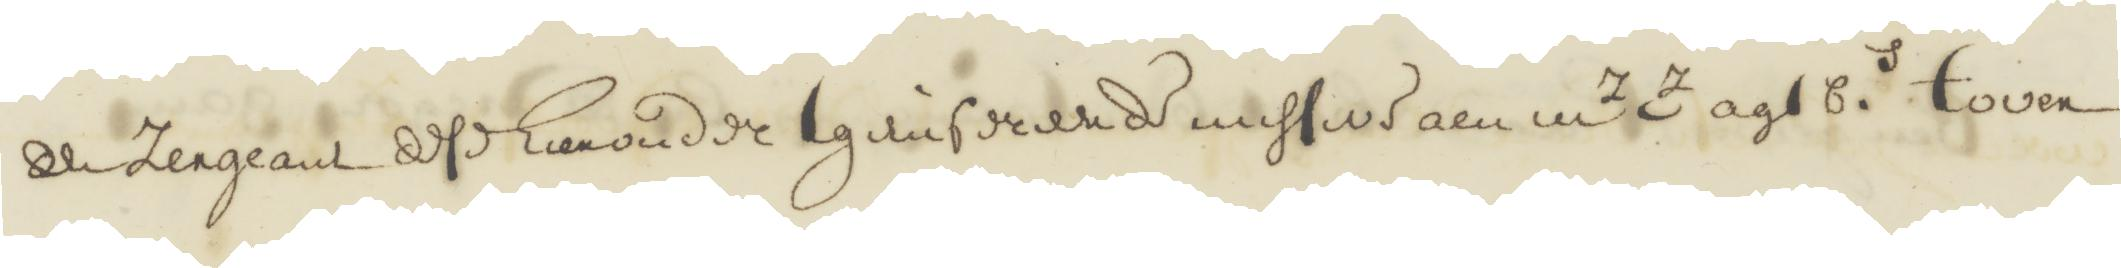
den zergeant dese hier onder tgeinsereerde missive aen u E E agtb.s tover
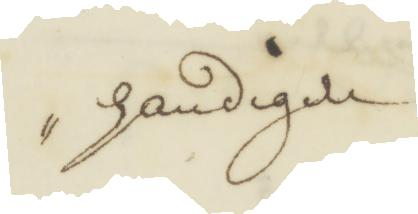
„ handigen
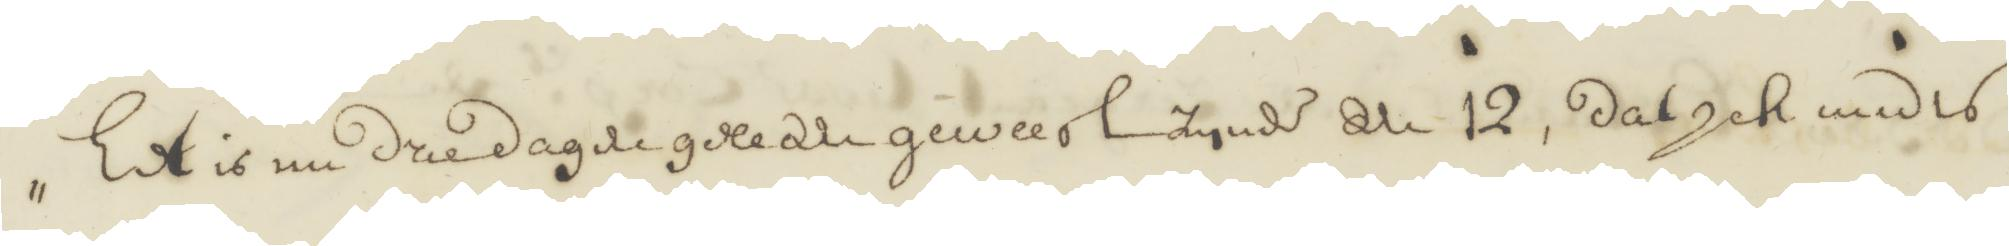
„ het is nu drie dagen geleden geweest zynde den 12, dat jck midts
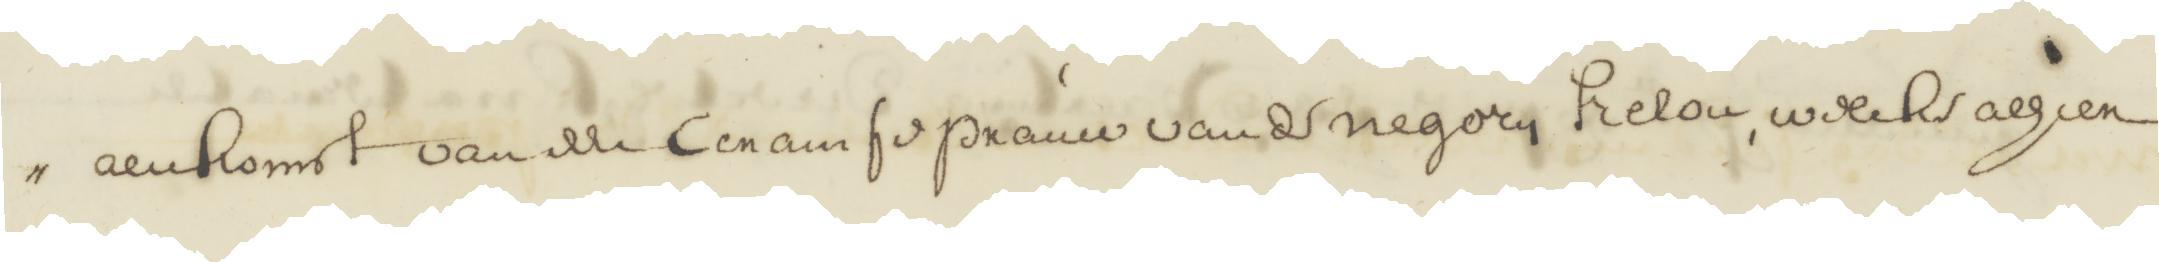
„ aenkomst van een Ceramse prauw van de negory Kelou, welcke alhier
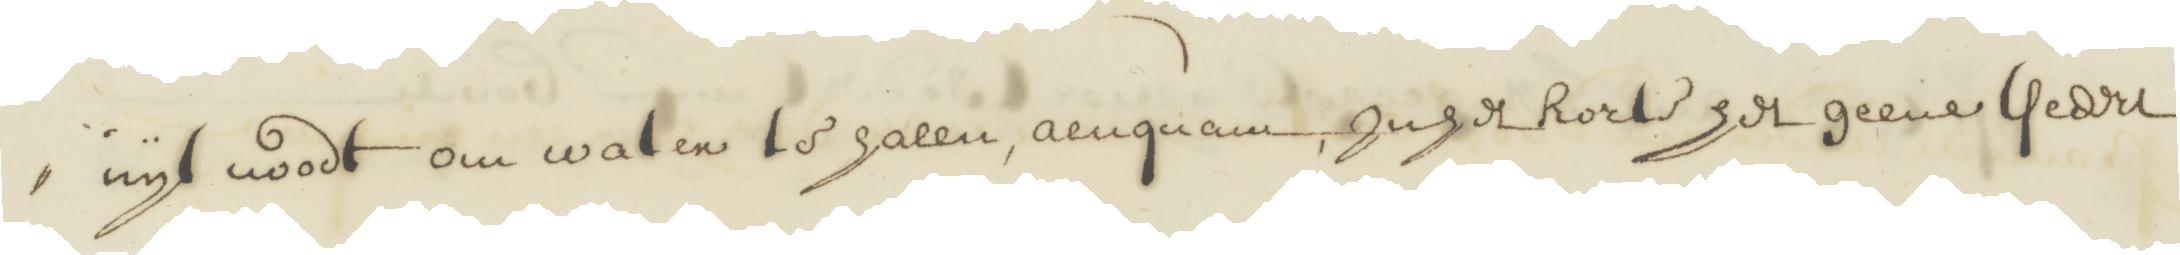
„ uijt noodt om water te halen, aenquam, in het korte het geene tsedert
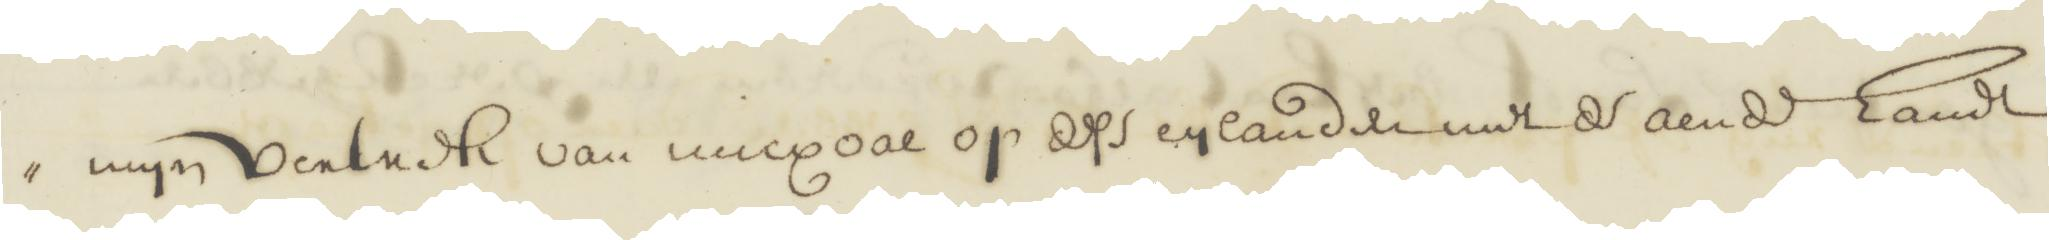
„ myn vertrek van micxoal op dese eylanden met de aen de handt
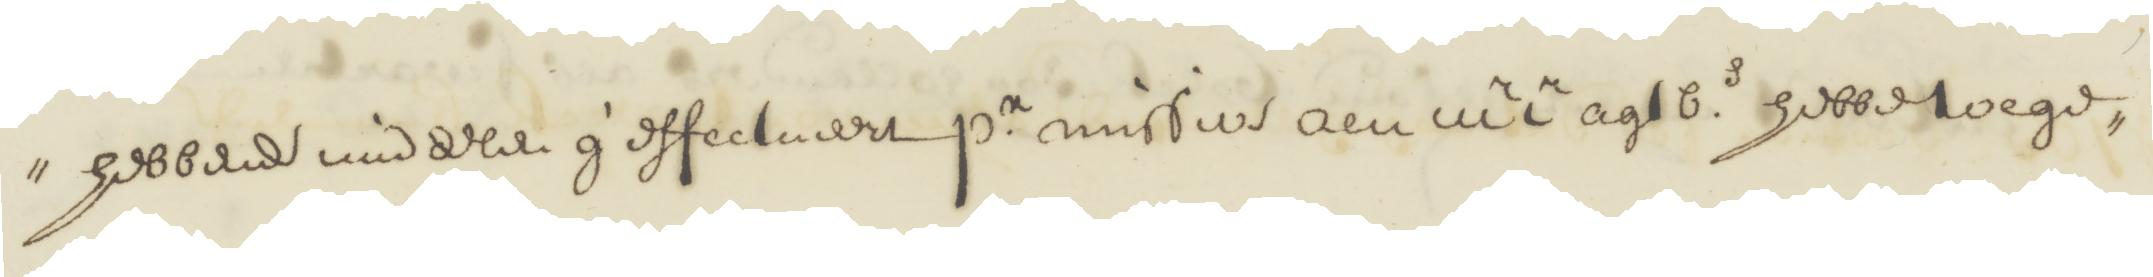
„ hebbende middelen g’effectueert p.r missive aen u E E agtb.s hebbe toege„
